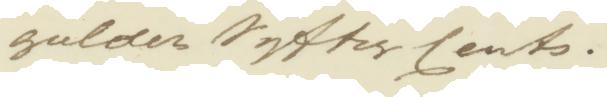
gulden Vyftig Cents.
